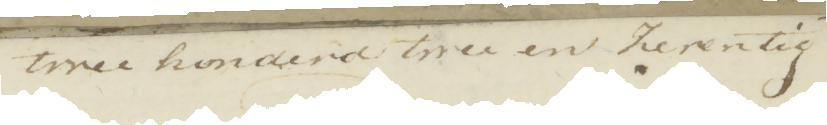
twee honderd twee en zeventig
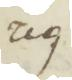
reg
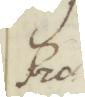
ho
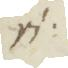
ri
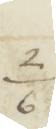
2/6
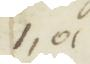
1, 01
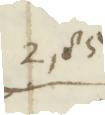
2,85
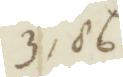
3,86
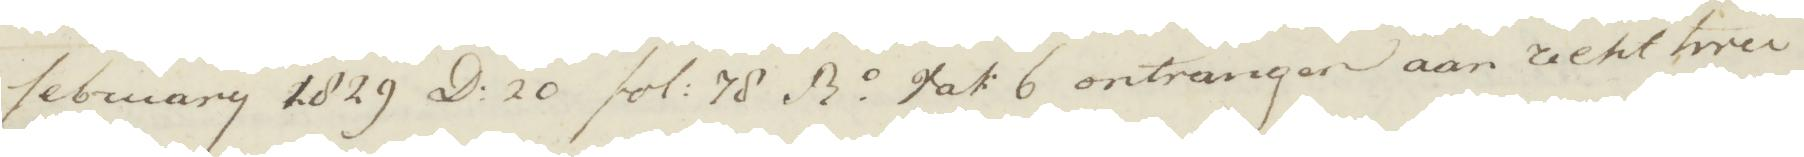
february 1829 D: 20 fol: 78 R.o vak 6 ontvangen aan recht twee
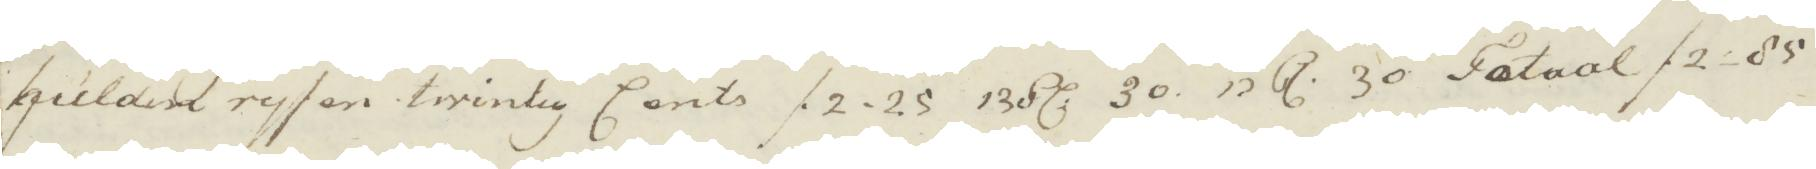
Gulden vyf en twintig Cents ƒ 2. 25 13pC: 30. 13pC. 30 Totaal ƒ 2: 85
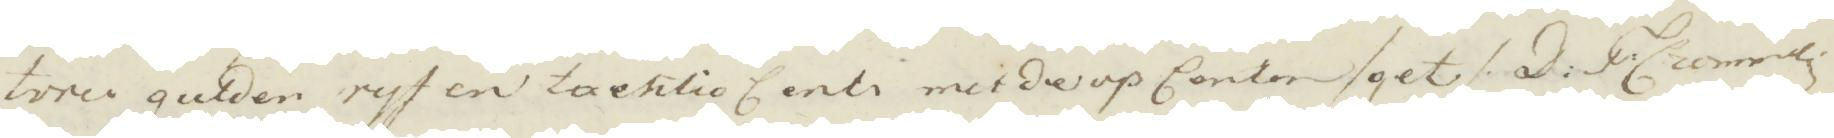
twee gulden vyf en tachtig Cents met de op Centen /get/ D:F: Crommelin
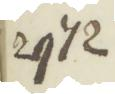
2972
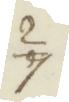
2/7
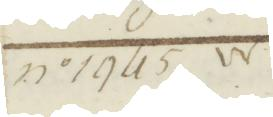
No 1945 W
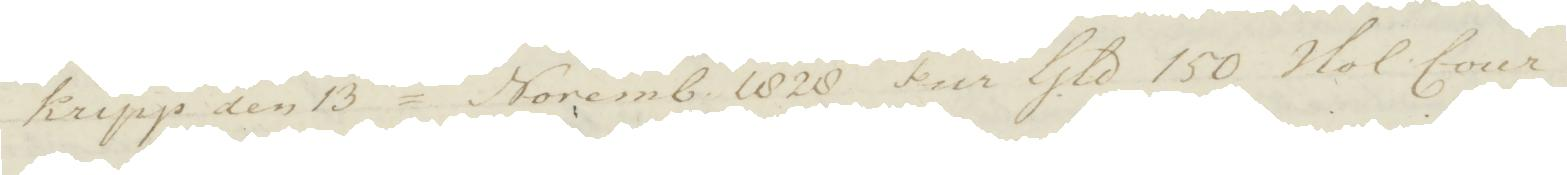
kripp den 13=ten Novemb: 1828 Fur Gld 150 Hol: Cour
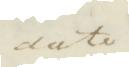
dato
